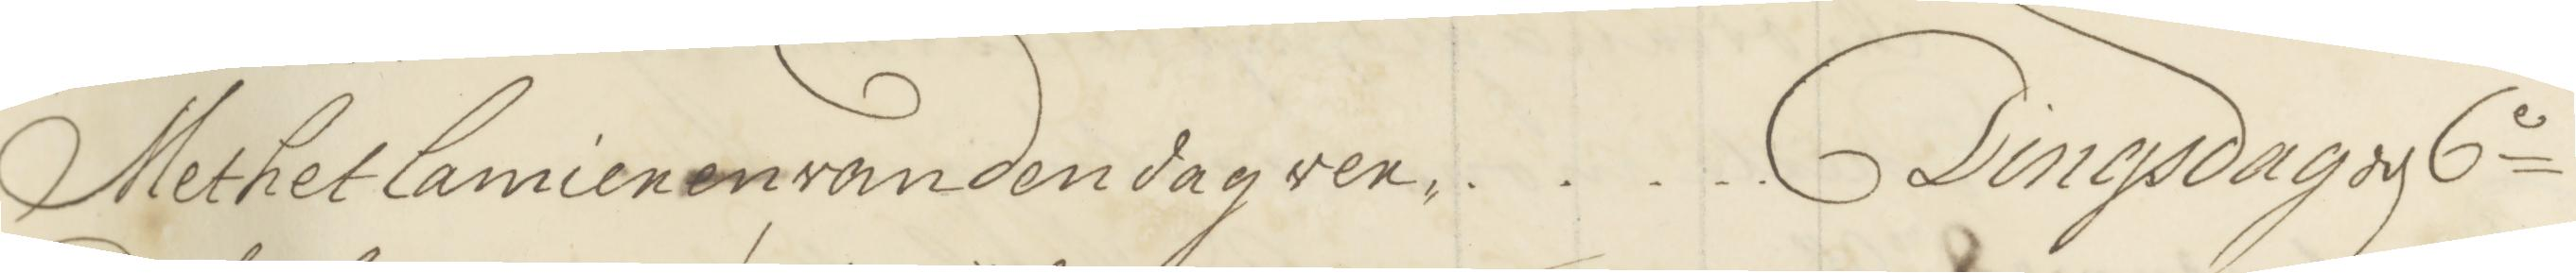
Met het lamieren van den dag ver„ . . . . . Dingsdags den 6=e
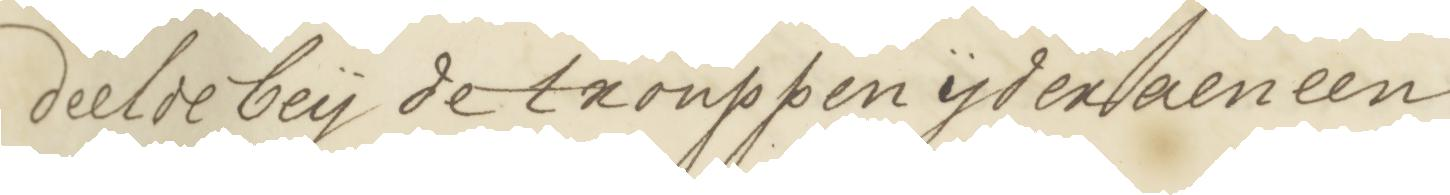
deelde beijde trouppen ijder aen een
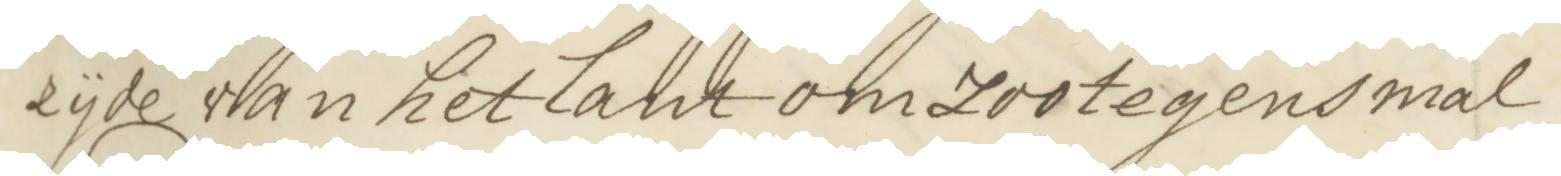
zijde van het lant om zoo tegens mal
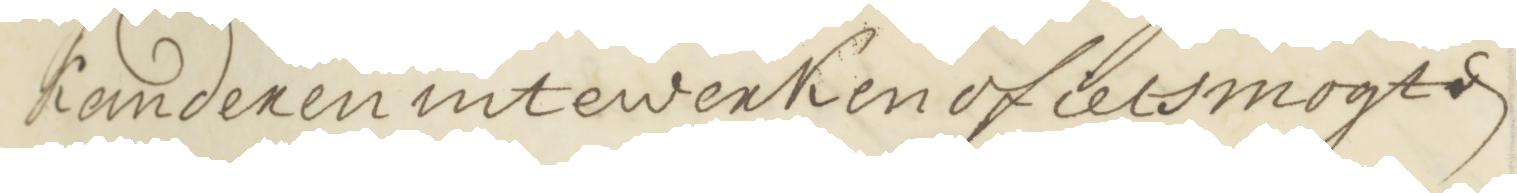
kanderen in te werken of iets mogte
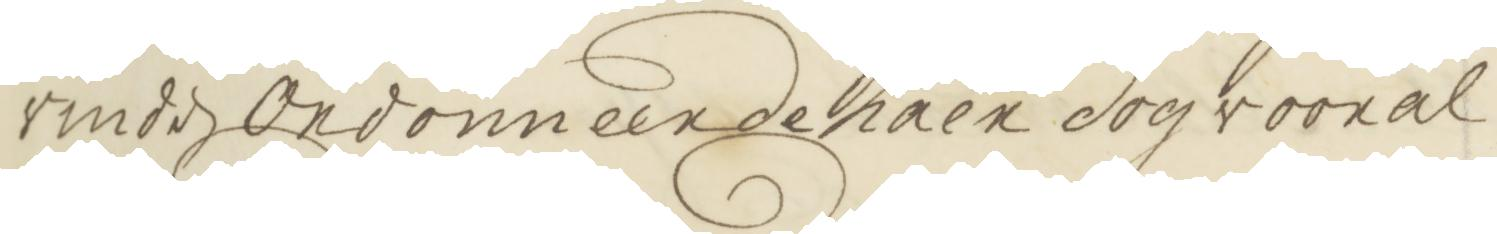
vinden Ordonneerde haer dog voor al
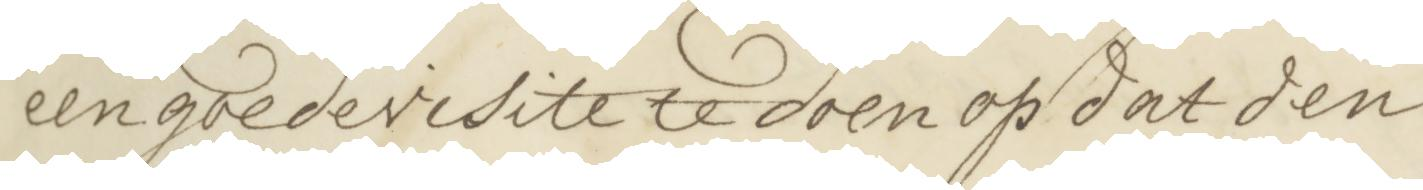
een goede visite te doen op dat den
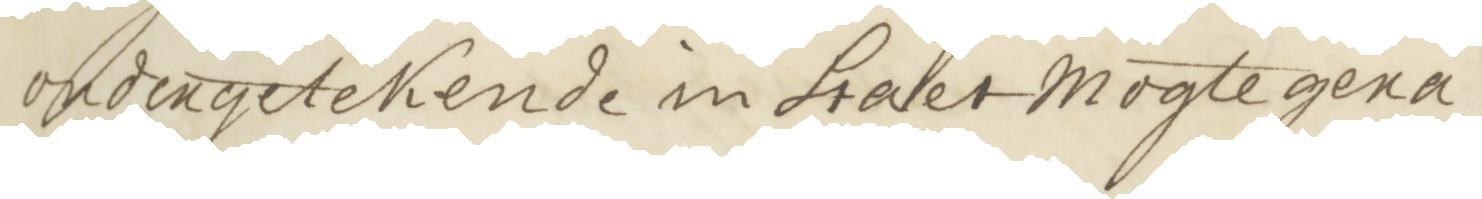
ondergetekende in staet mogte gera
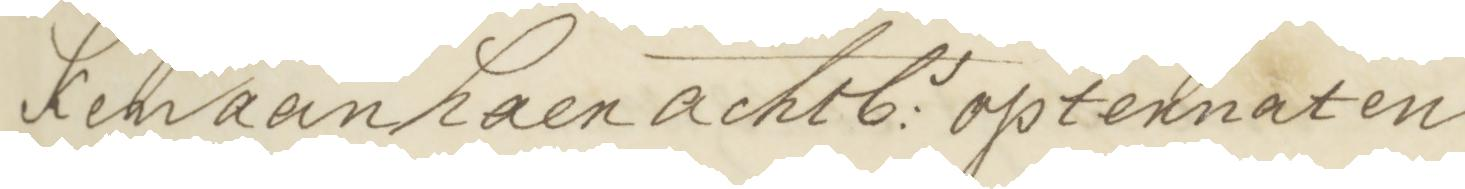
ken aan haer achtb:s op ternaten
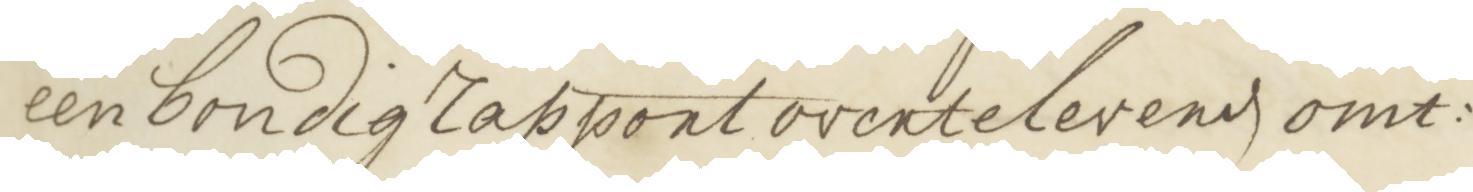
een bondig rapport over te leveren omt:t
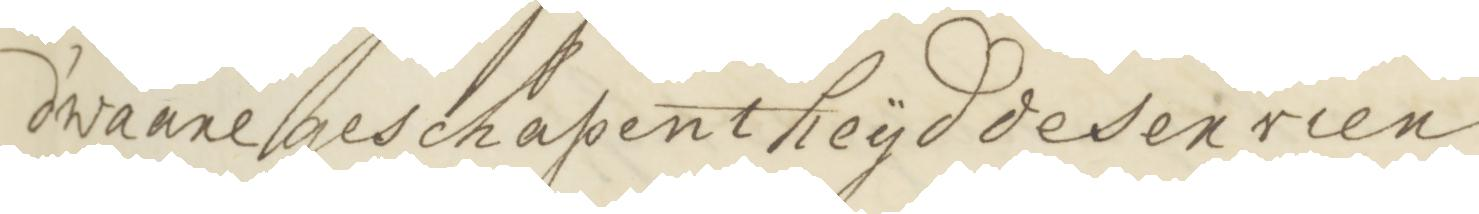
d'waare geschapentheijd deser vier
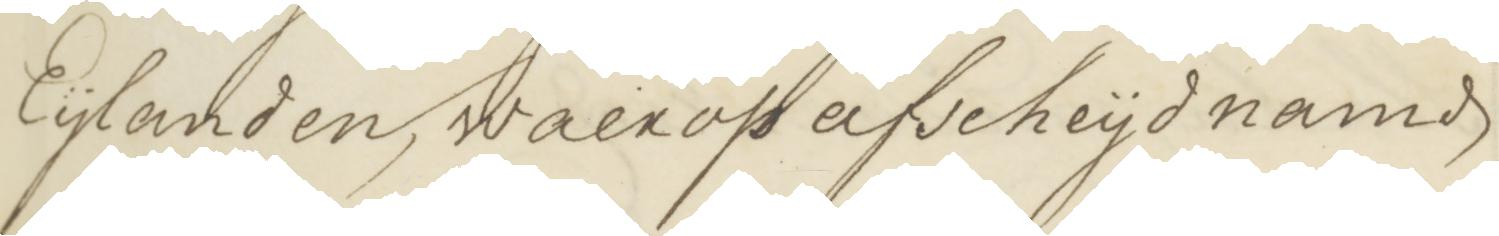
Eijlanden, waer op afscheijd namen
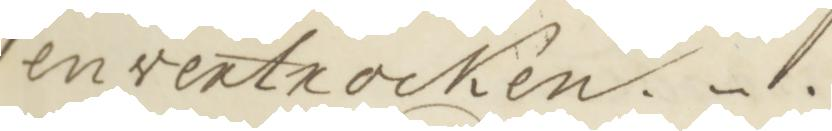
en vertrocken. ~ .
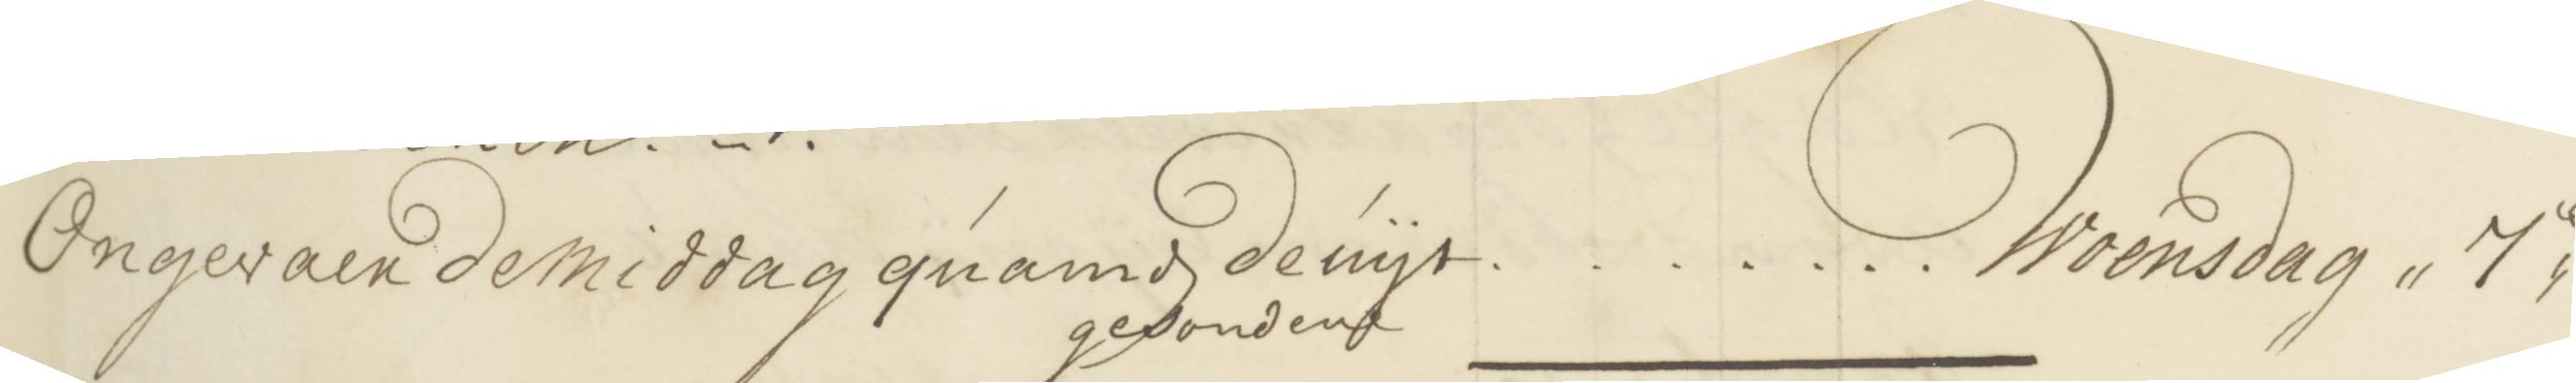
Ongevaer de middag quamen de uijt . . . . . . Woensdag „ 7„e
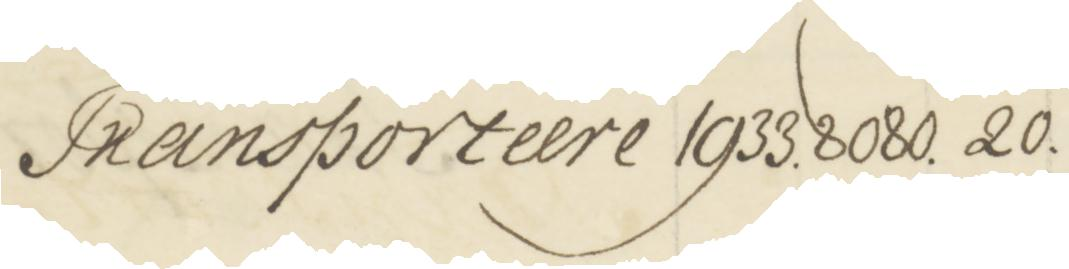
Transporteere 1933.8080.20.
